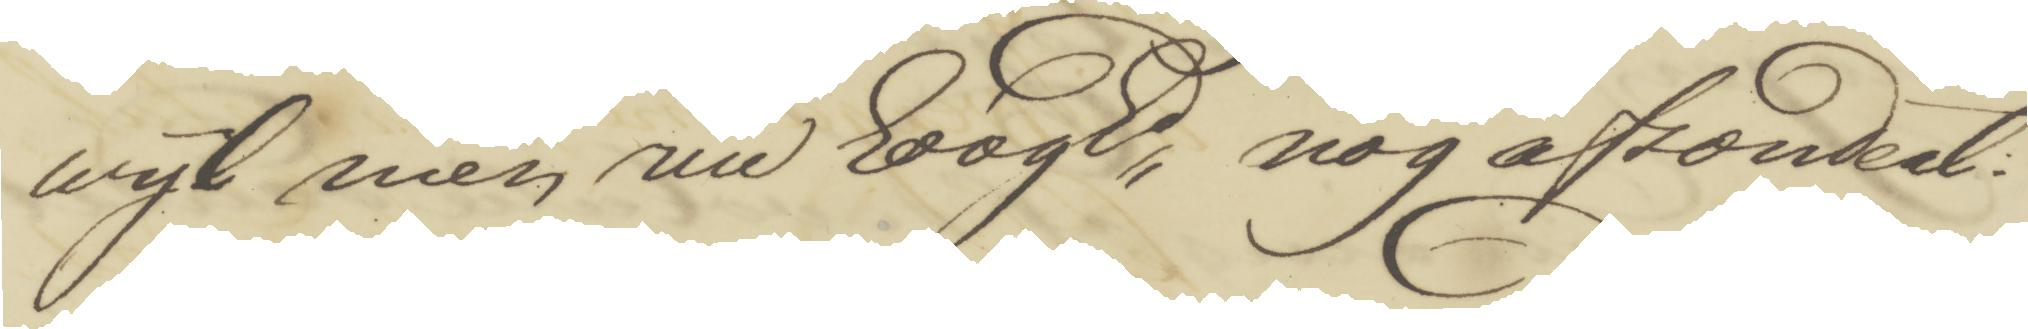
wijl men uw hoogh„d nog afsonderlijk
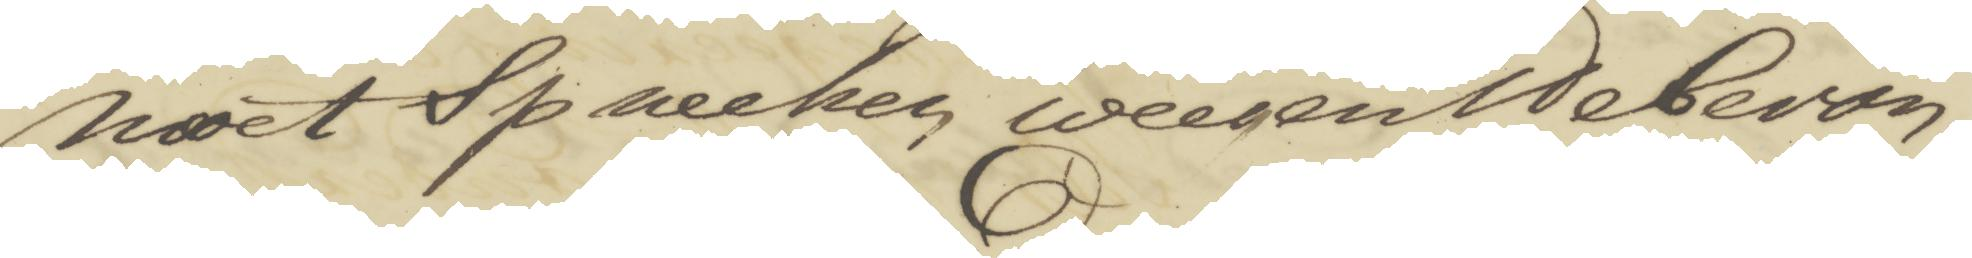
moet spreeken weegens de bevon
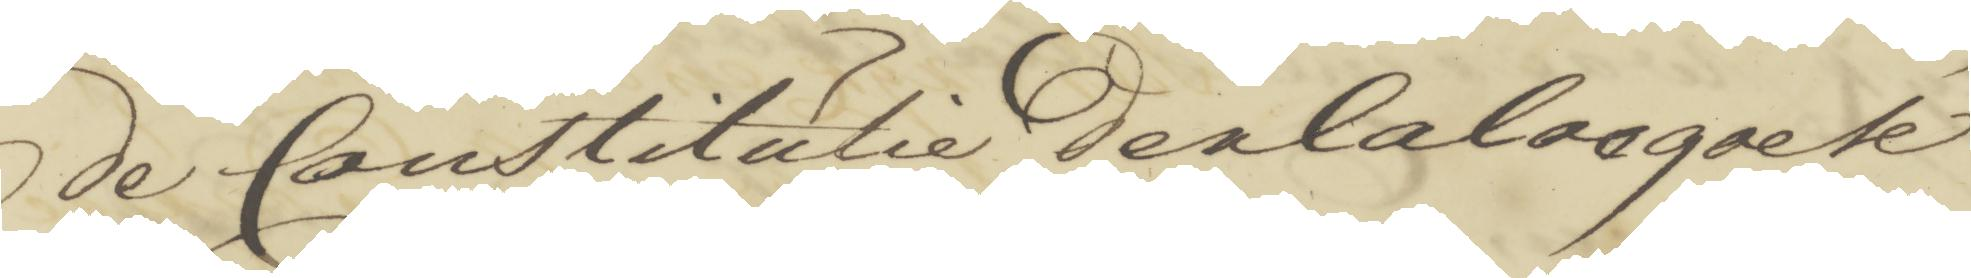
de Constitutie der lalosgoese
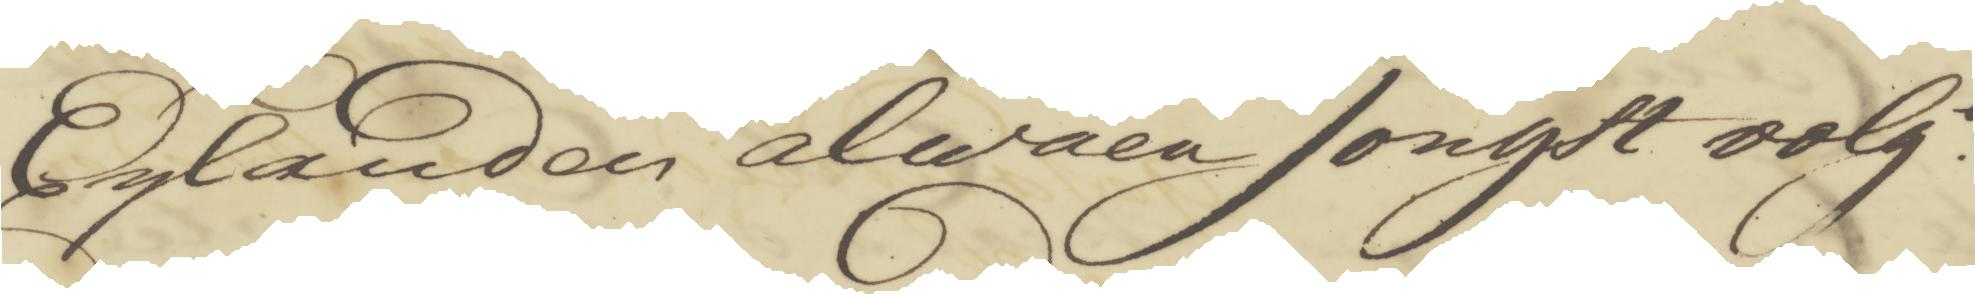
Eylanden alwaer Jongst volgt
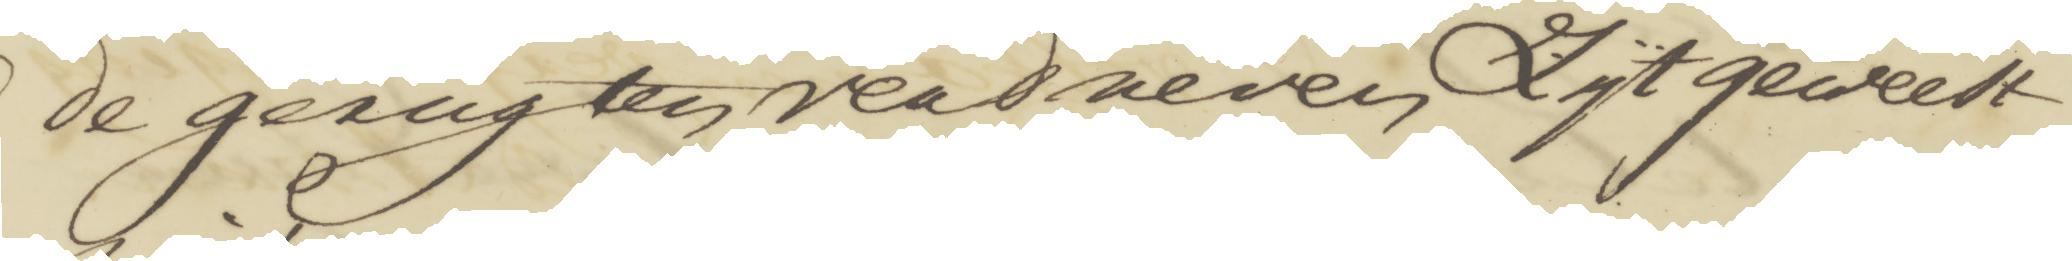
de gerugten verdreven Zijt geweest
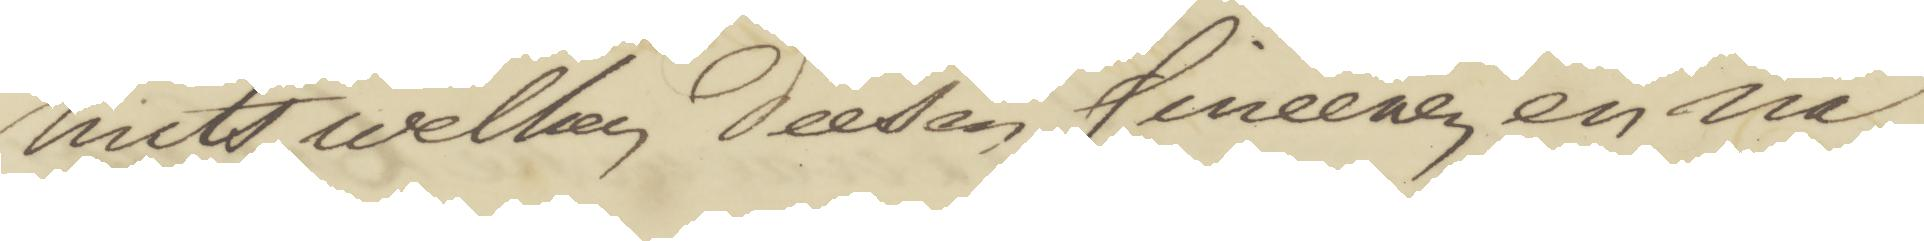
mits welken deesen fineeren en na
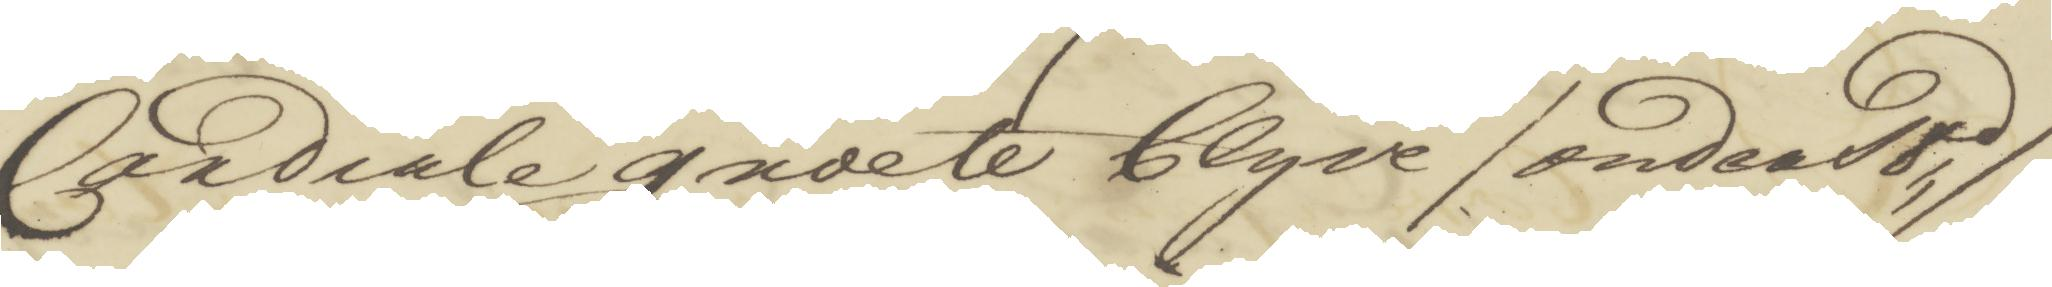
Cordiale groete blyve /onderst„d/
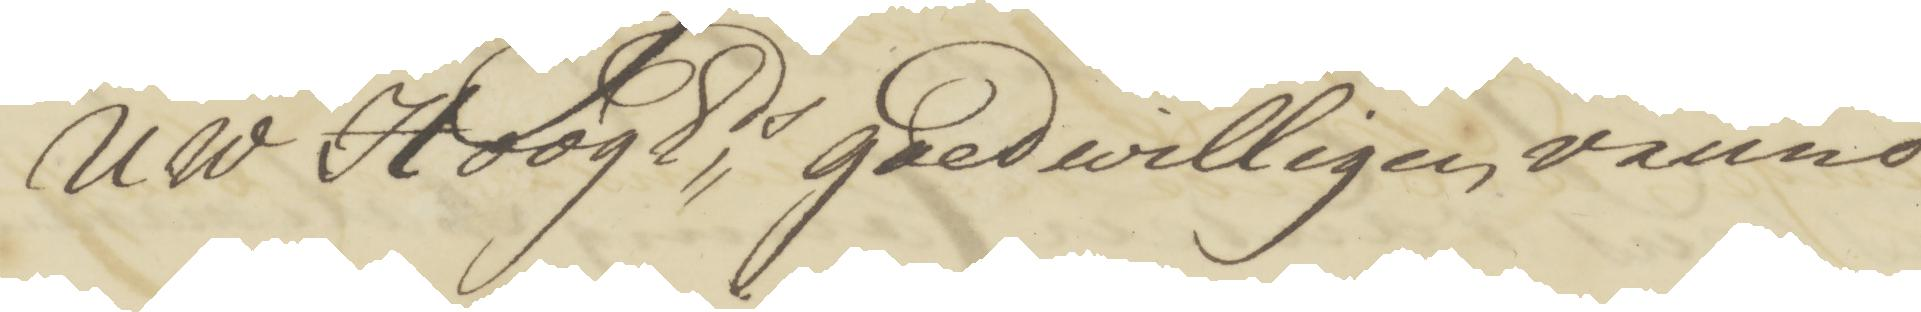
uw Hoogh„ds goedwilligen vrund
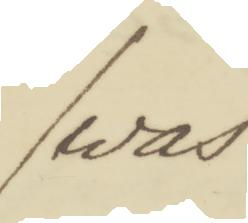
/was
